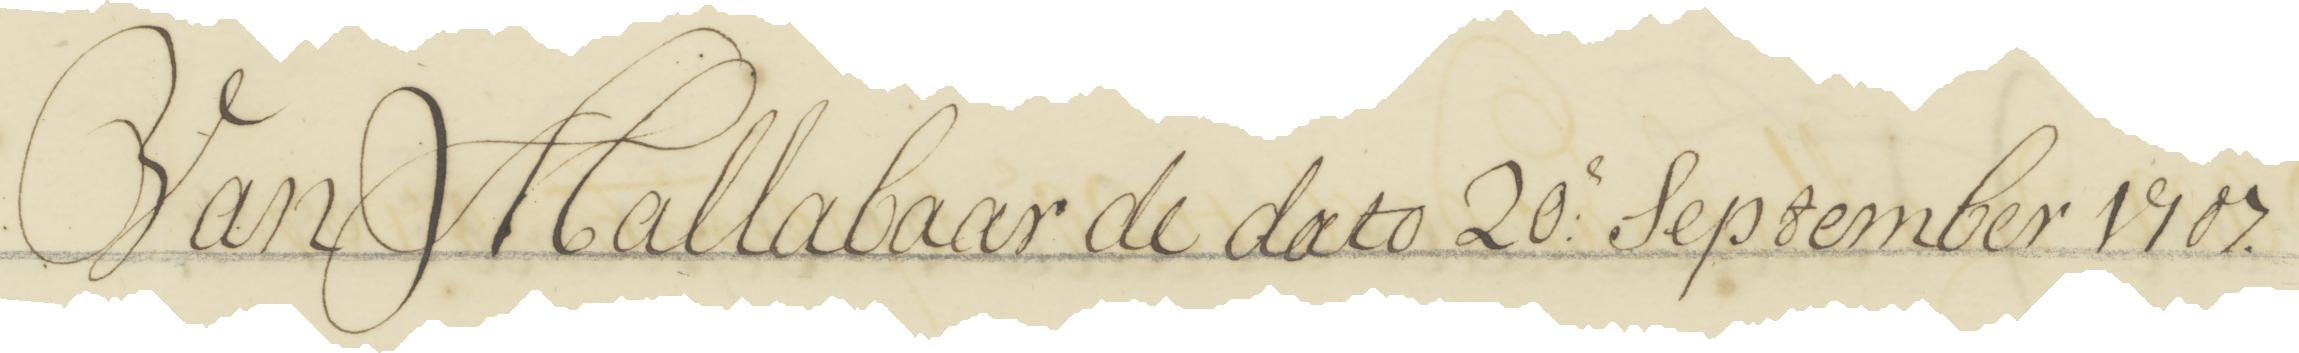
Van Mallabaar de dato 20:en September 1707.
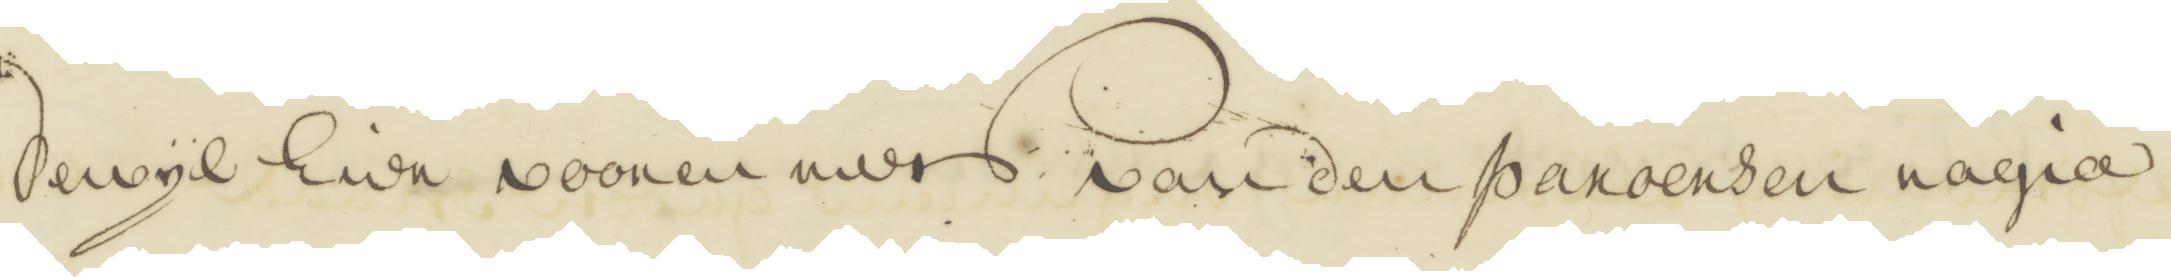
dewijl hier vooren reets: van den paroersen ragia
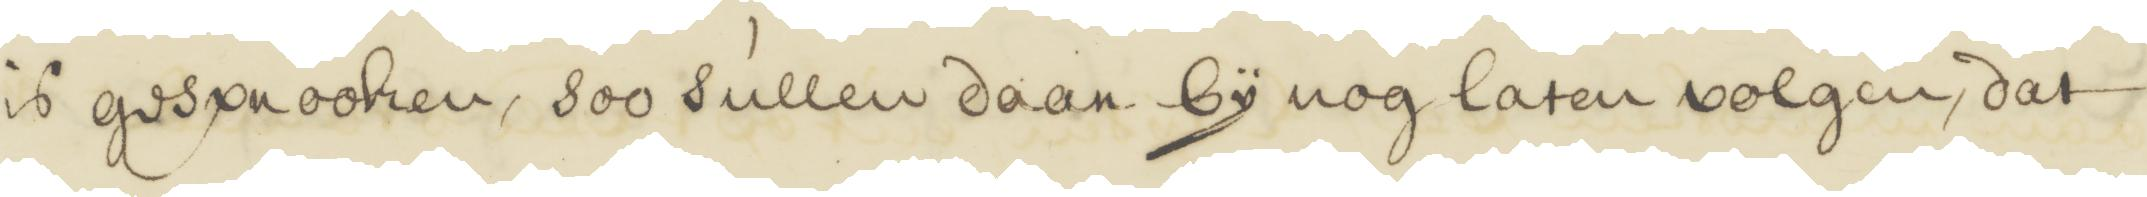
is gesprooken, soo sullen daar bij nog laten volgen, dat
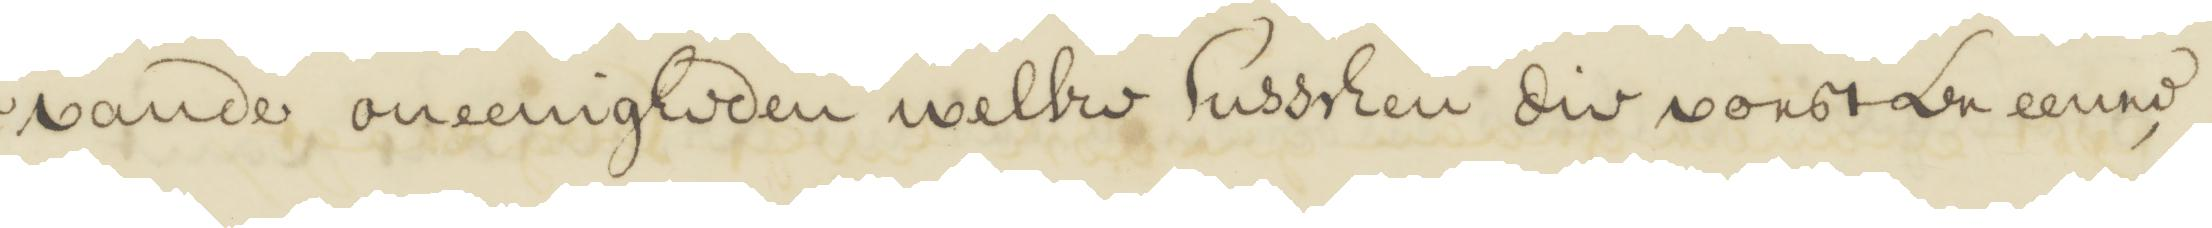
vande oneenigheden welke tusschen die vorst ter eenre,
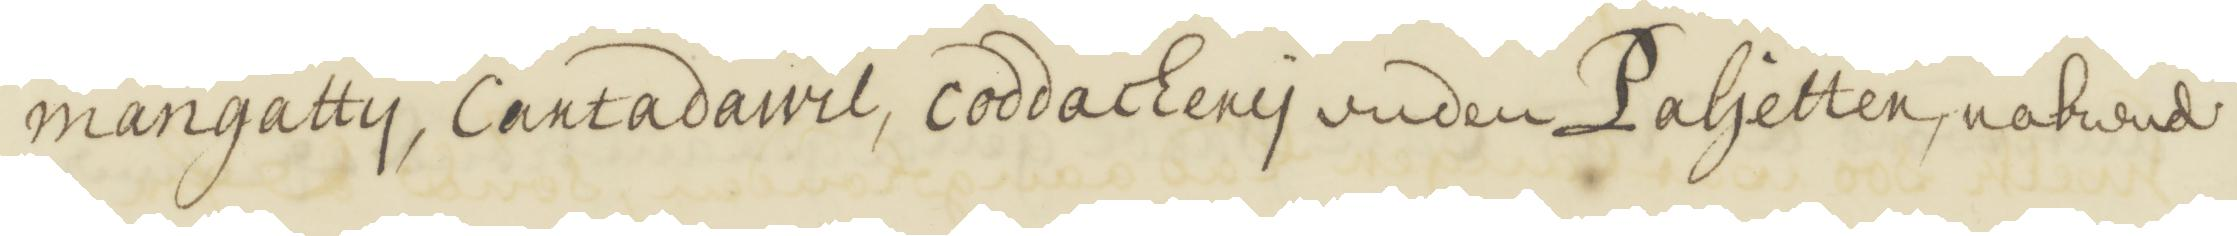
mangattij, cartadawil, coddacherij enden Paljetter, rakende
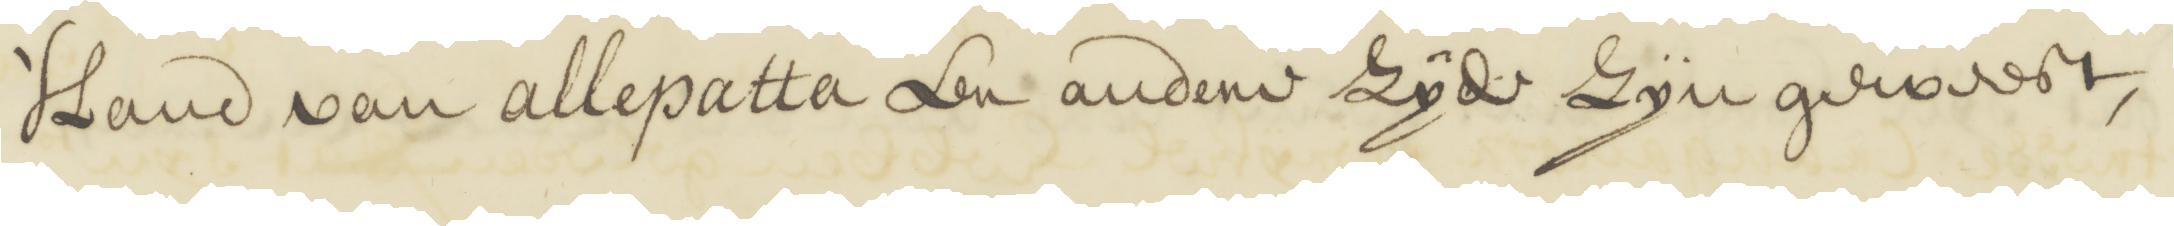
'tLand van allepatta ter andere zijde zijn geweest,
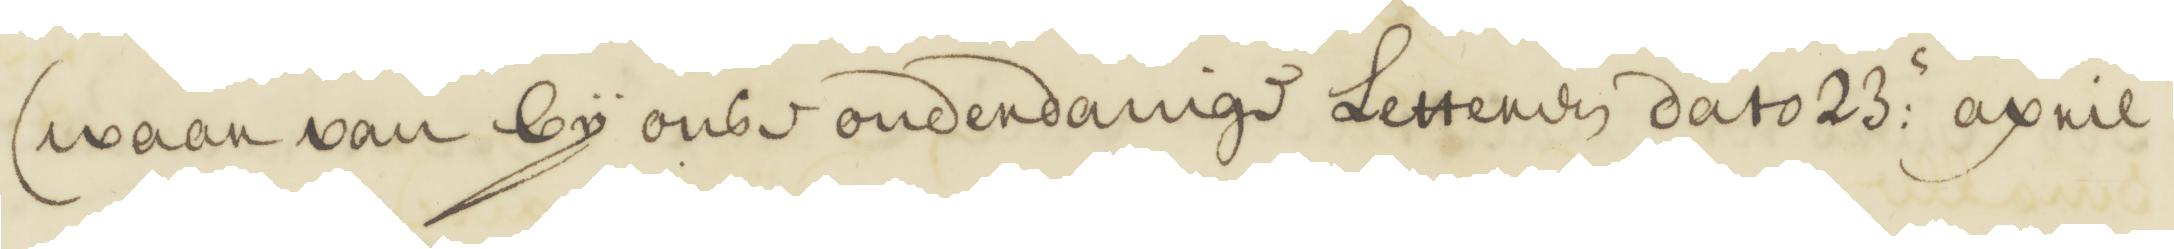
(waar van bij onse onderdanige letteren dato 23:en april
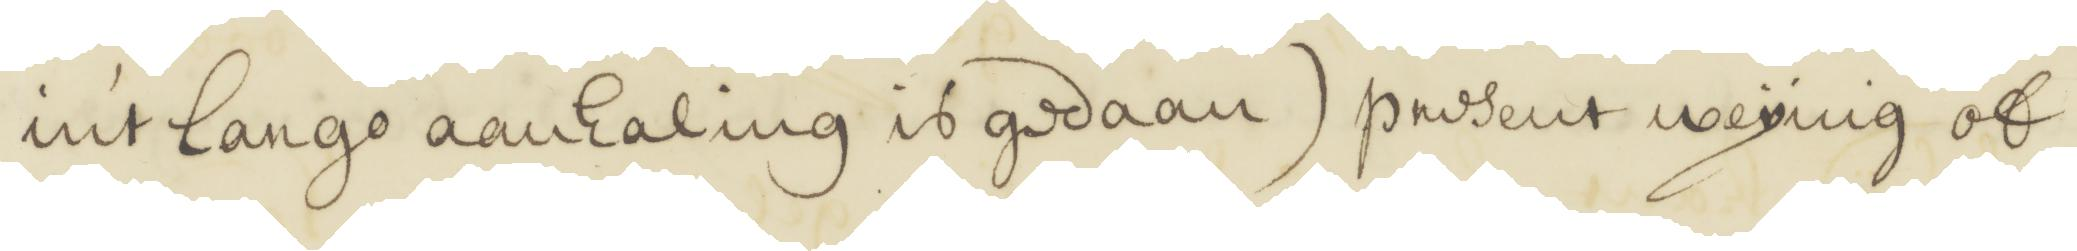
in’t lango aanhaling is gedaan) present weijnig of
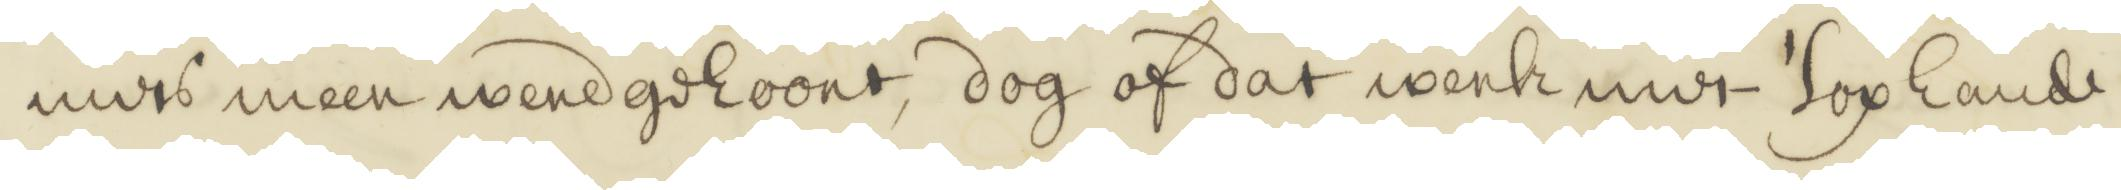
niets meer werd gehoort, dog of dat werk met 'top hande
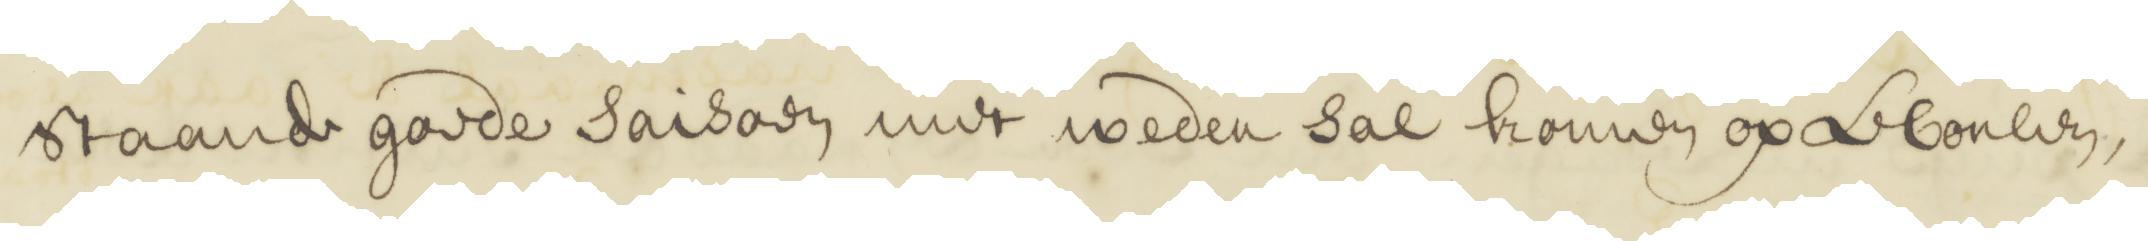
staande goede saisoen niet weder sal komen op te borlen,
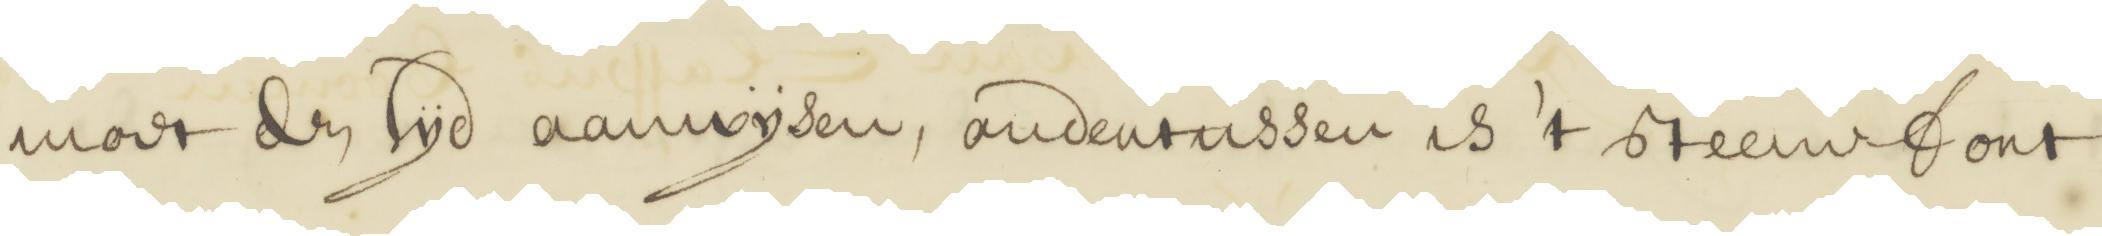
moet den tijd aanwijsen, ondertussen is ’t steene fort
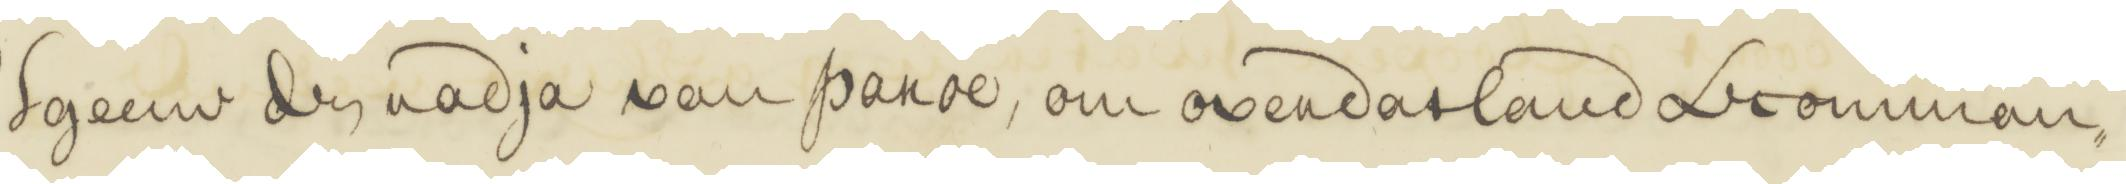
t geene den radja van paroe, om over datland tecomman„
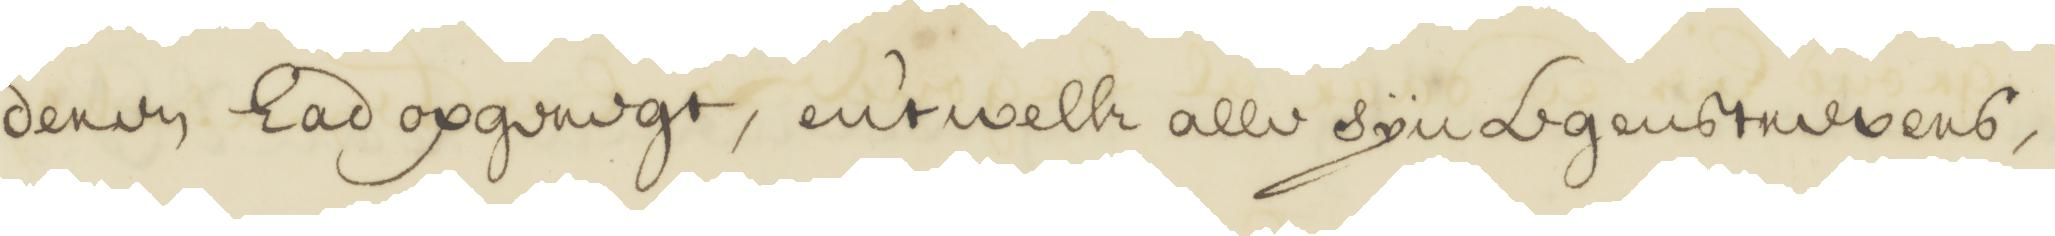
deren had opgeregt, en’t welk alle sijn tegenstrevers,
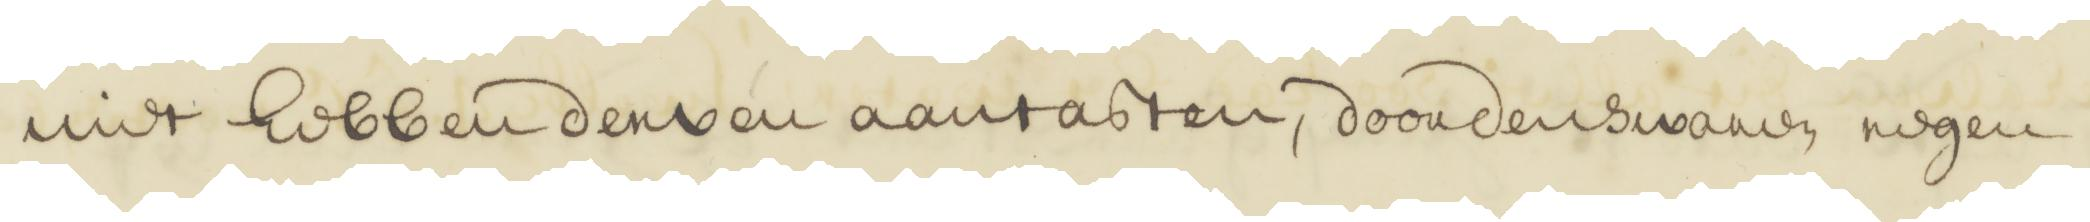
niet hebben derven aantasten, door den swaren regen
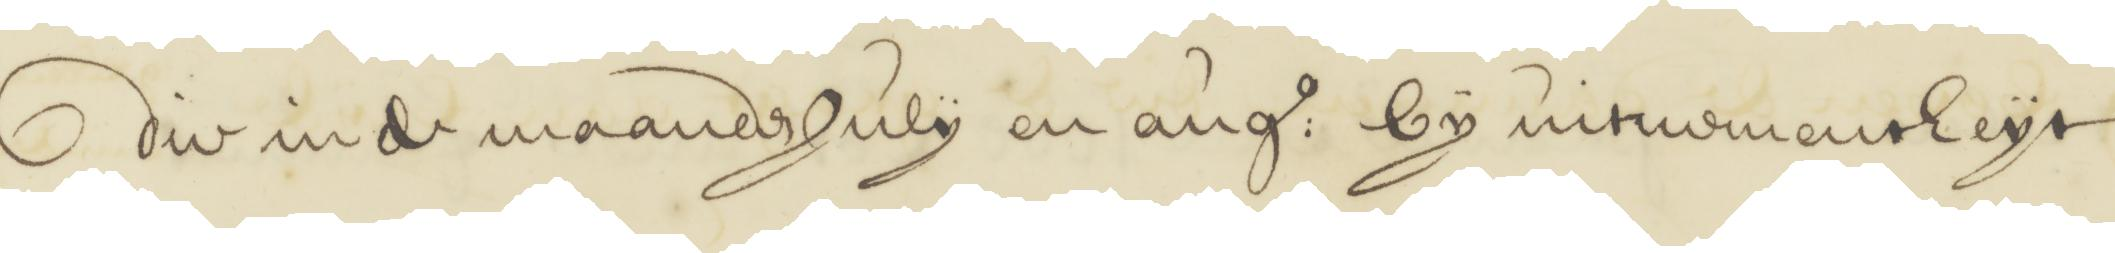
die in de maanden Julij en aug:o bij uitnementheijt
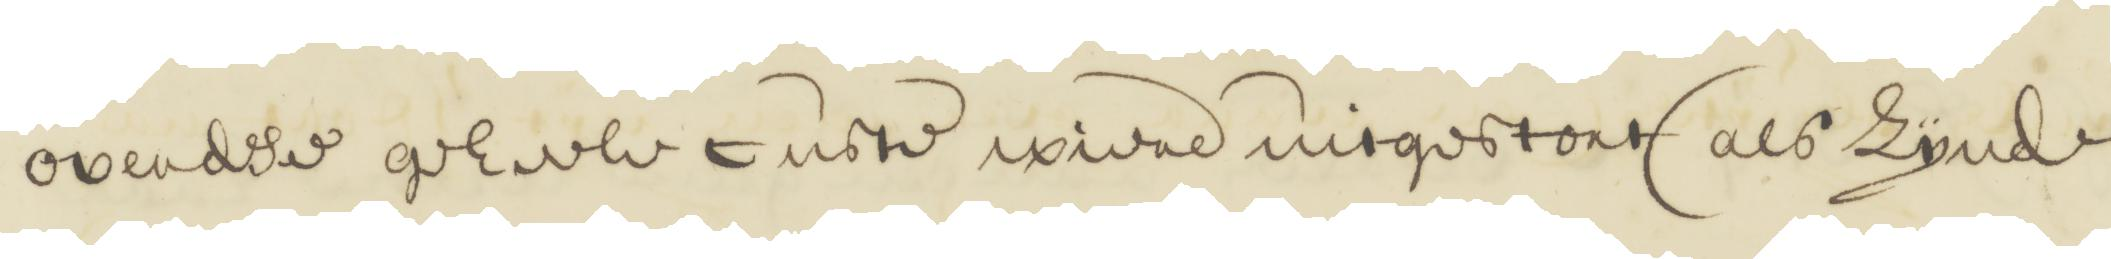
over dese geheele custe wierd uitgestort (als zijnde
